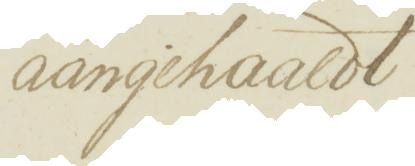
aangehaaldt
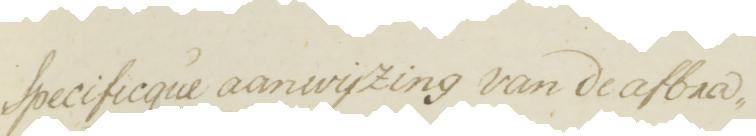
specificque aanwijzing van de afbra„
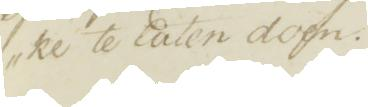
„ke te laten doen.
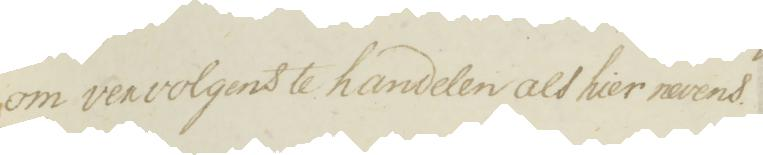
om vervolgens te handelen als hier nevens.
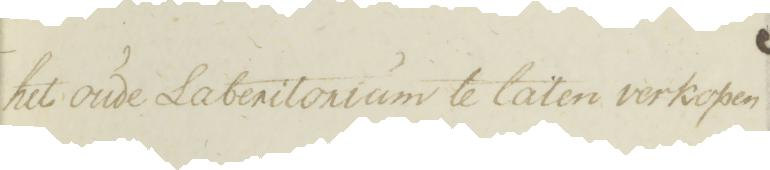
het oude Laberitorium te laten verkopen
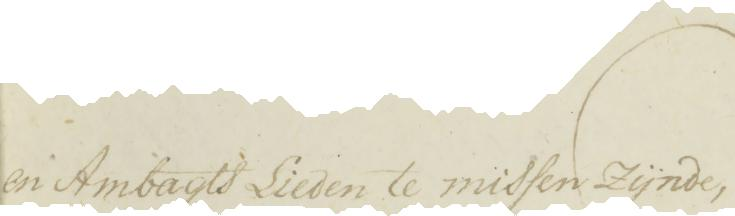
en Ambagts Lieden te missen zijnde,
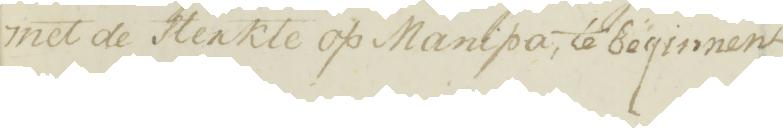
met de Sterkte op Manipa, te beginnen
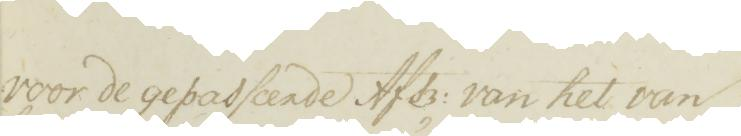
voor de gepasseerde Afsz: van het van
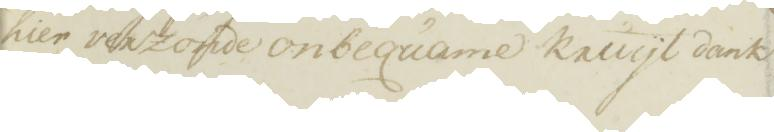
hier verzonde onbequame Kruijt dank
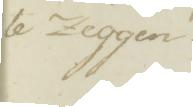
te zeggen
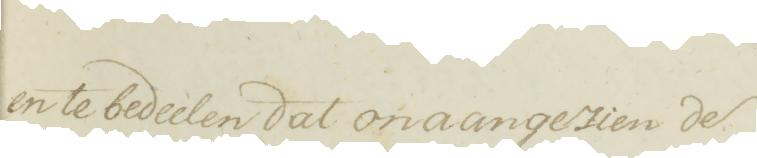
en te bedeelen dat onaangezien de
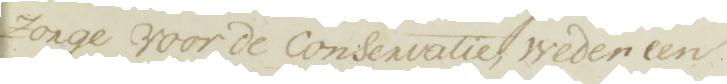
zorge voor de conservatie, weder een
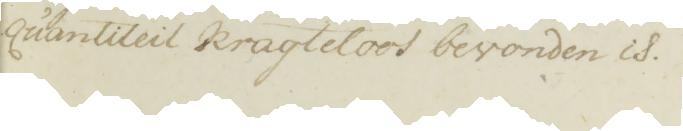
quantiteit kragteloos bevonden is.
